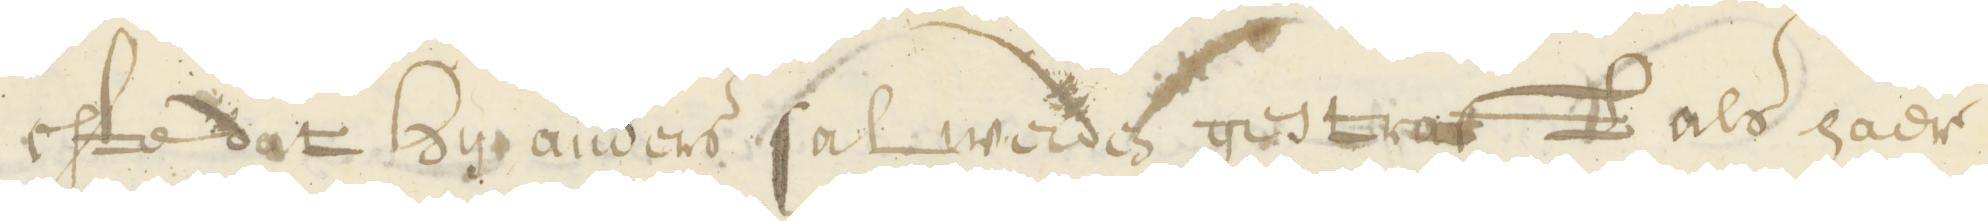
ofte dat Hy anders Sal werden gestraft als haer
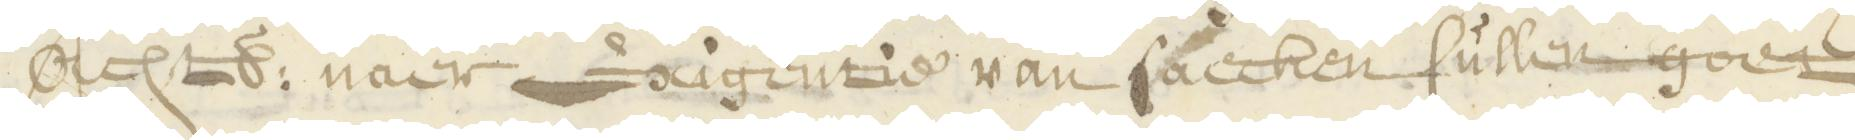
Agtb: naer Exigentie van saecken sullen goet
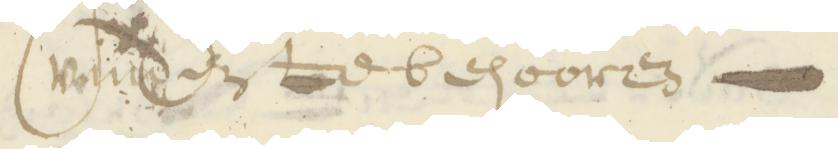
vinden te behooren —
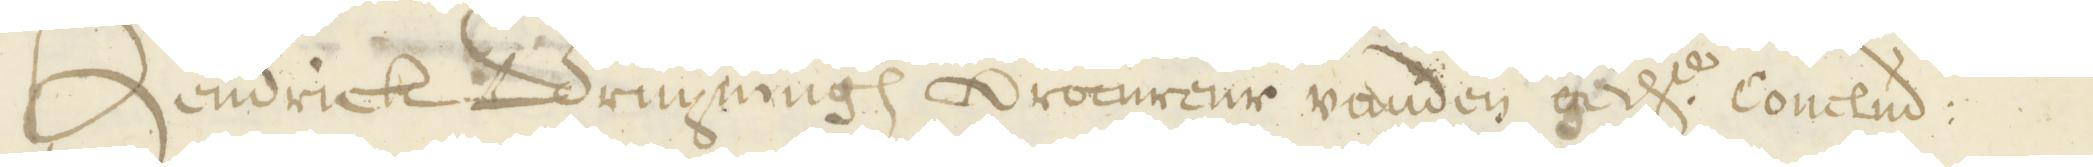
Hendrick Bruijningh procureur vanden ged:e conclud:t
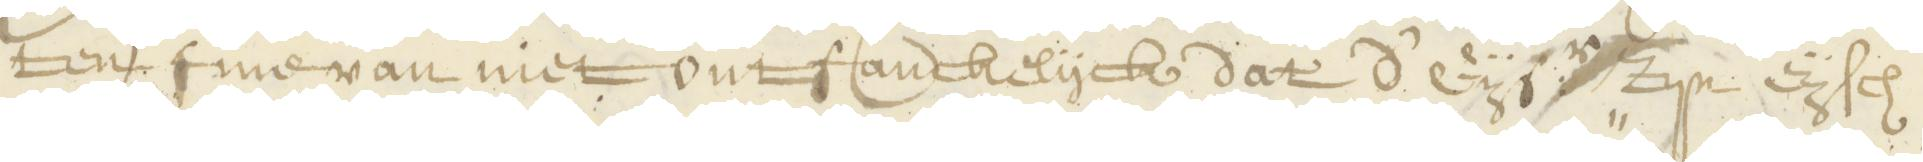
ten fine van niet ontfanckelijck dat d’ Eijs:r Zyn eijsch
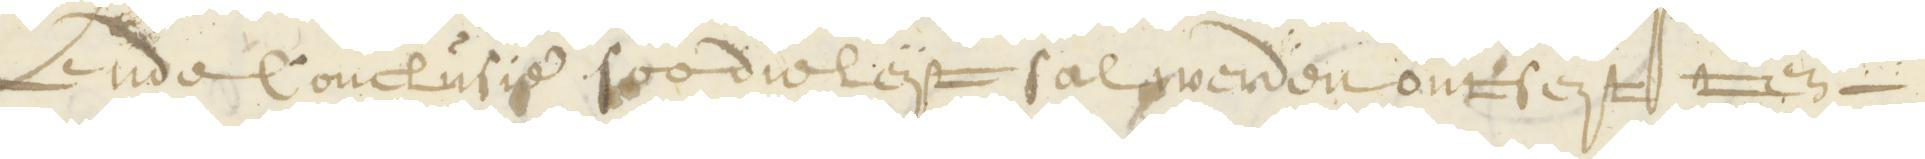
Ende Conclusie soo die leijt sal werden ontseijt ten —
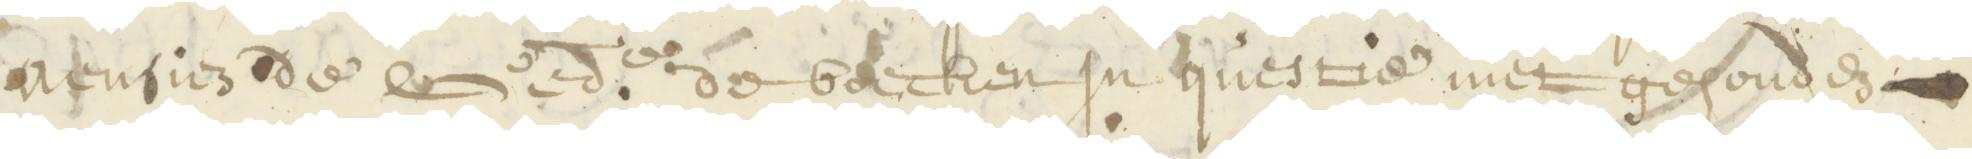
aensien de Ged„e de boecken Jn questie niet gehouden —
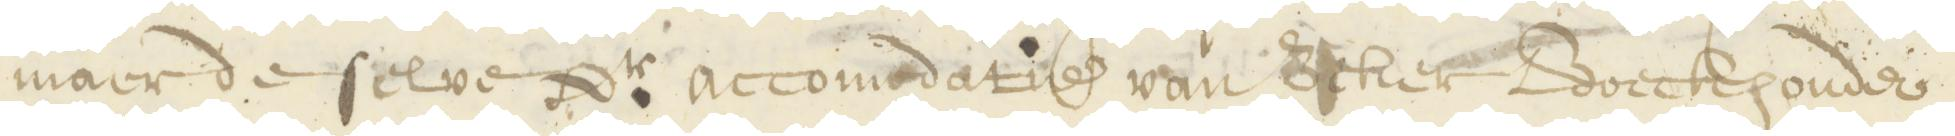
maer de selve p„r accomodatie van Zeker Boeckhouder
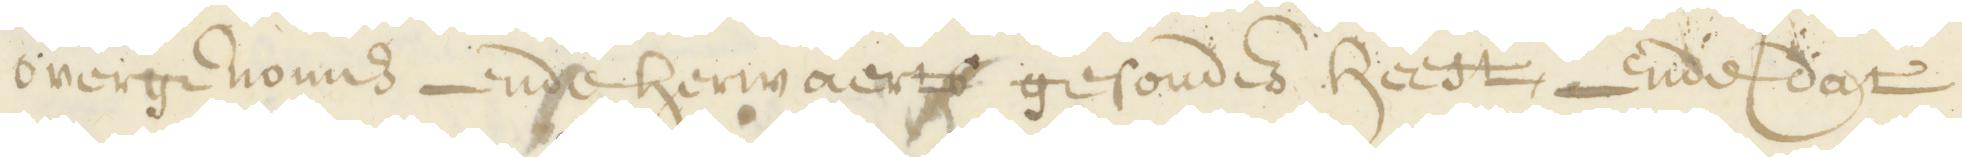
overgenomen ende herwaerts gesonden heeft, ende dat
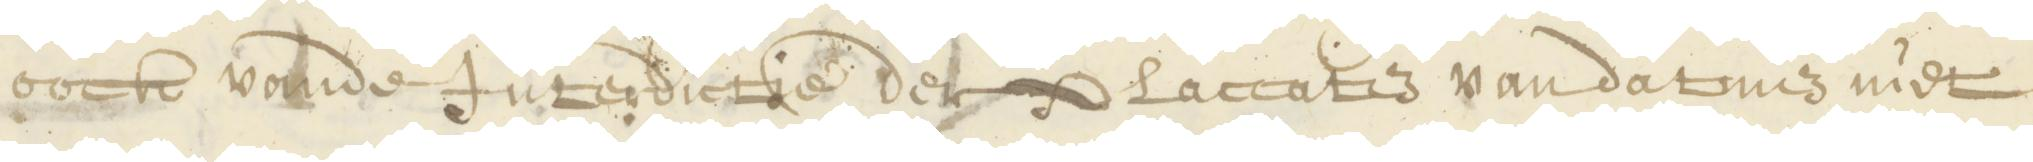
oock vande Jnterdictie der placcaten van dat men niet
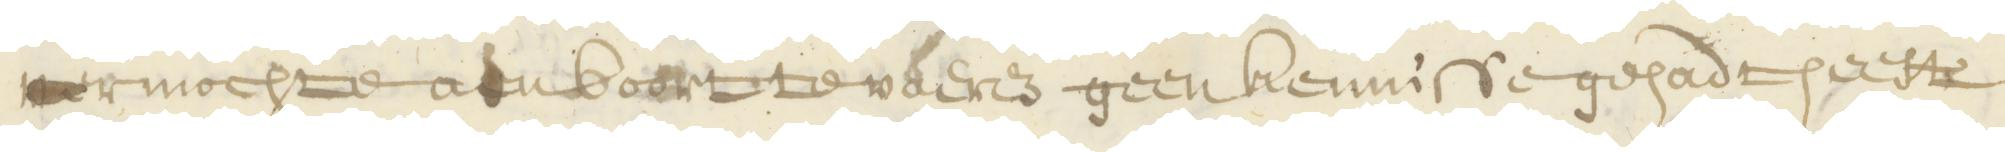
vermogte aenboort te voeren geen kennisse gehadt heeft
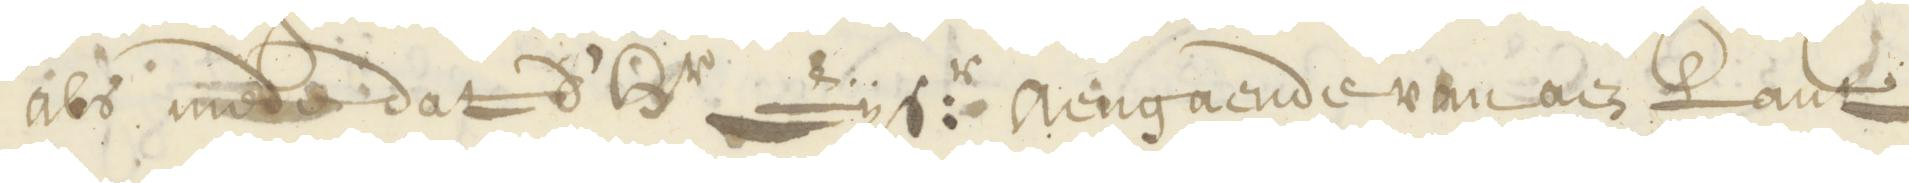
als mede dat d’ Hr Eijs:r Aengaende van aen Lant
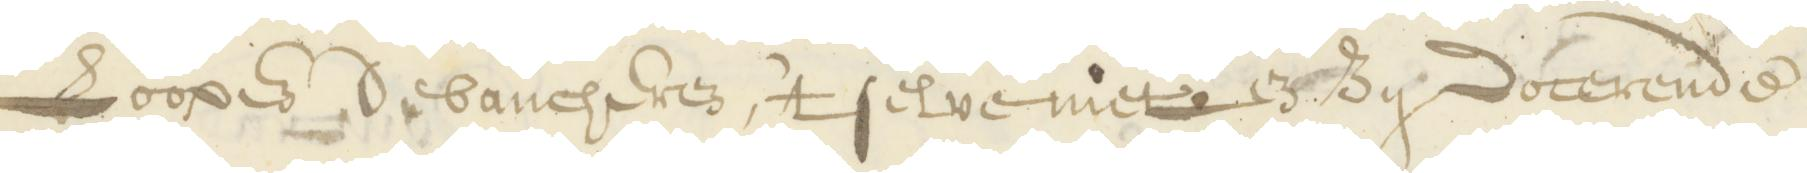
Loopen debaucheren, ’t selve niet en Zij docerende
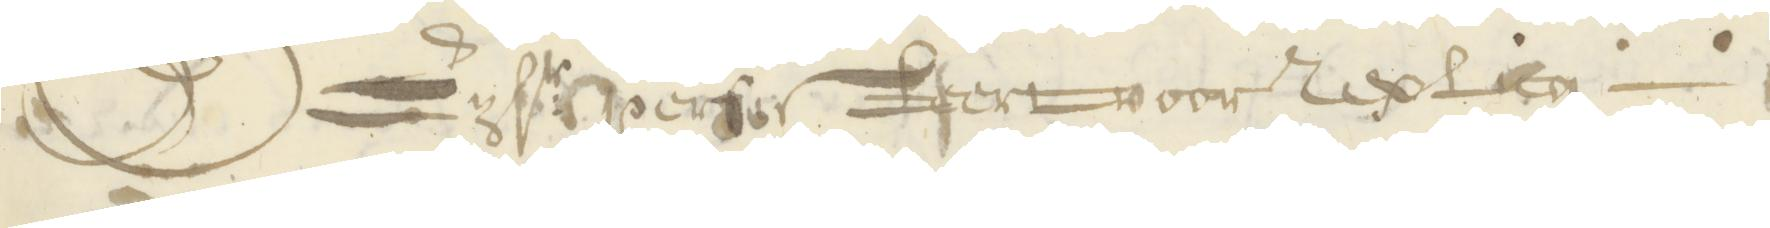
D Eijs:r persisteert voor Replicq —
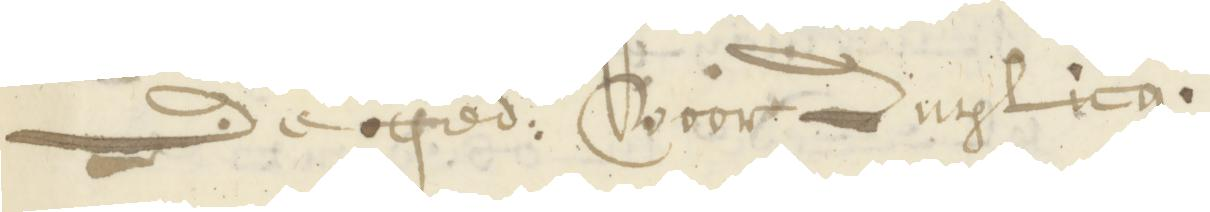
De ged:e voor Duplicq.
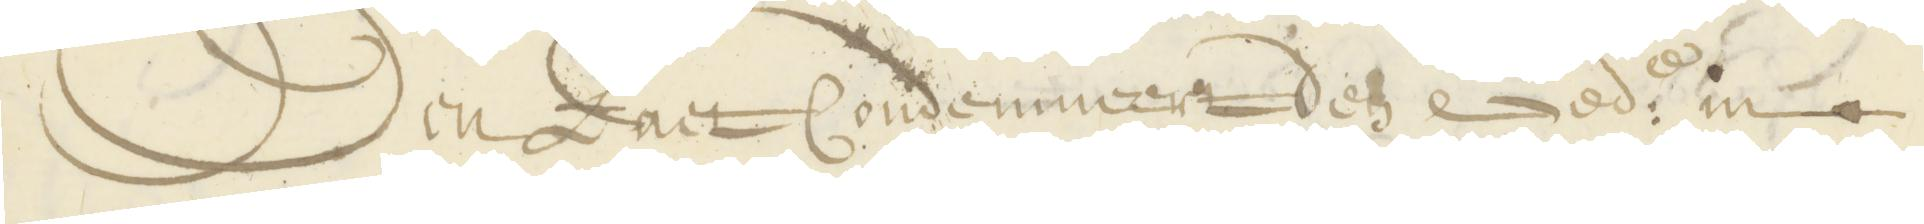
Den Raet Condemneert den Ged:e in
